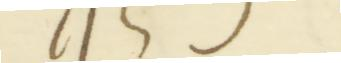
453
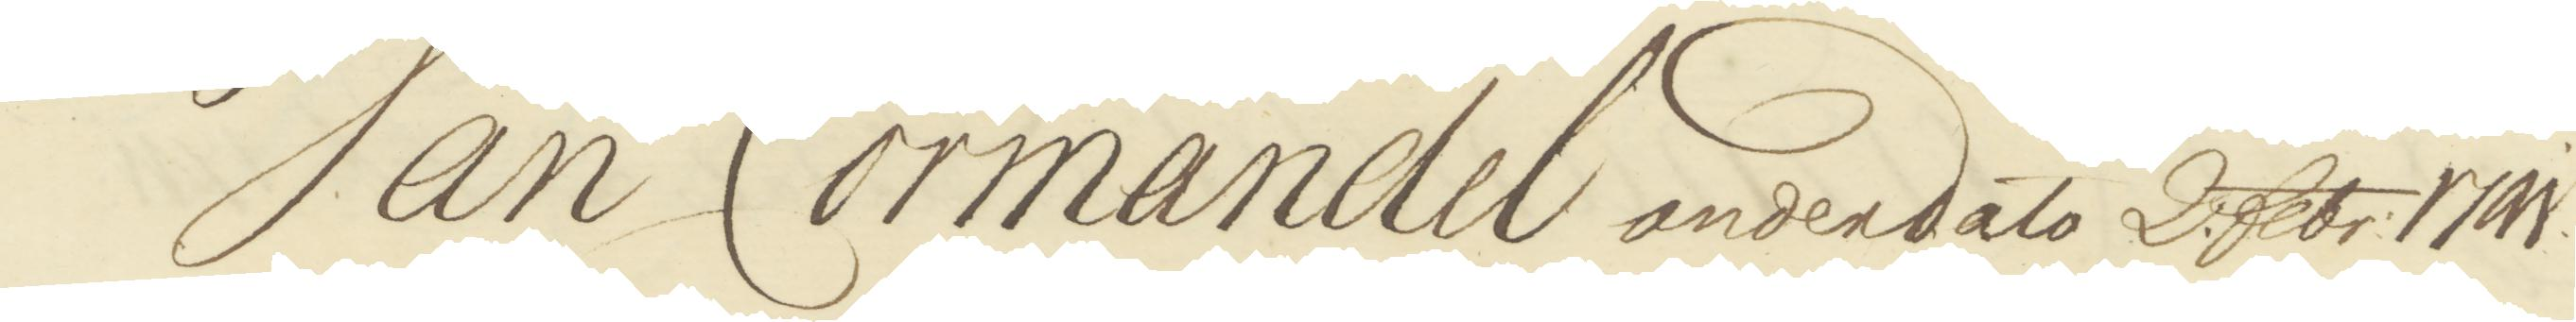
Van Cormandel onderdato 2. febr: 1741.
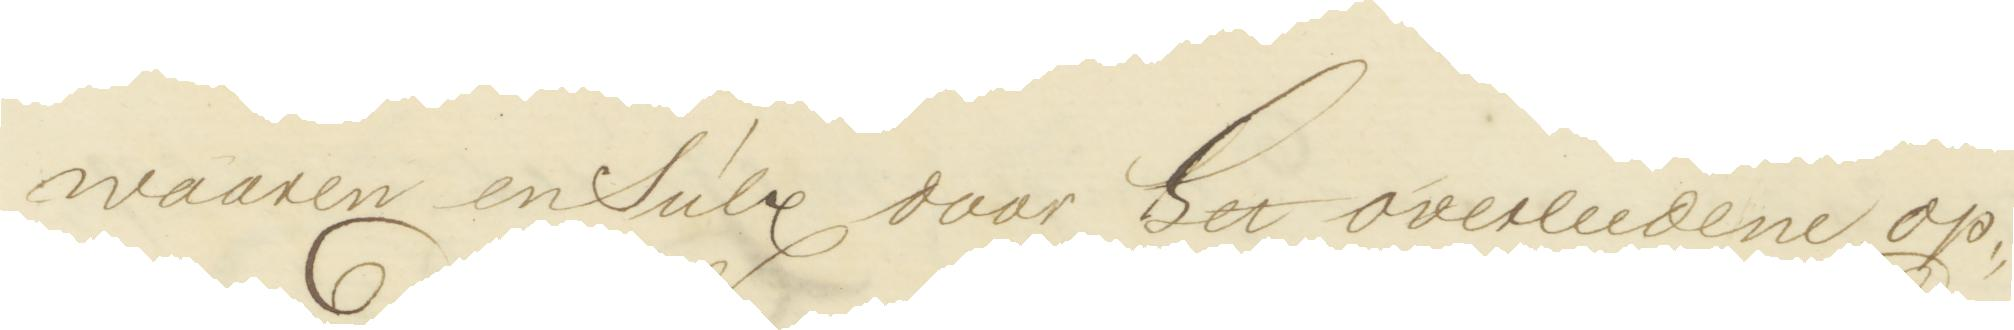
waaren en sulx door het overleedene op„
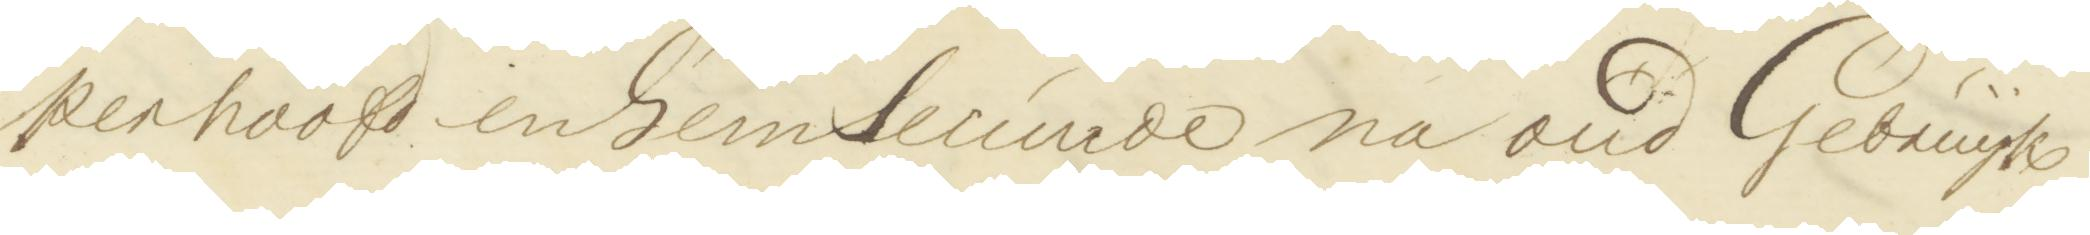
perhoofd, en hemsecunde na oud Gebruijk
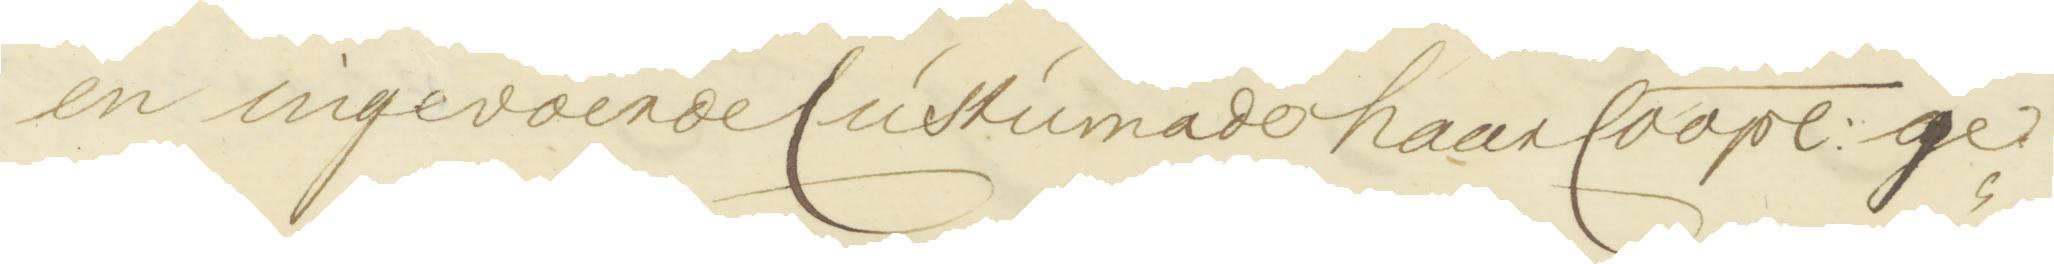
en ingevoerde Custumade haar Coopl: ge„
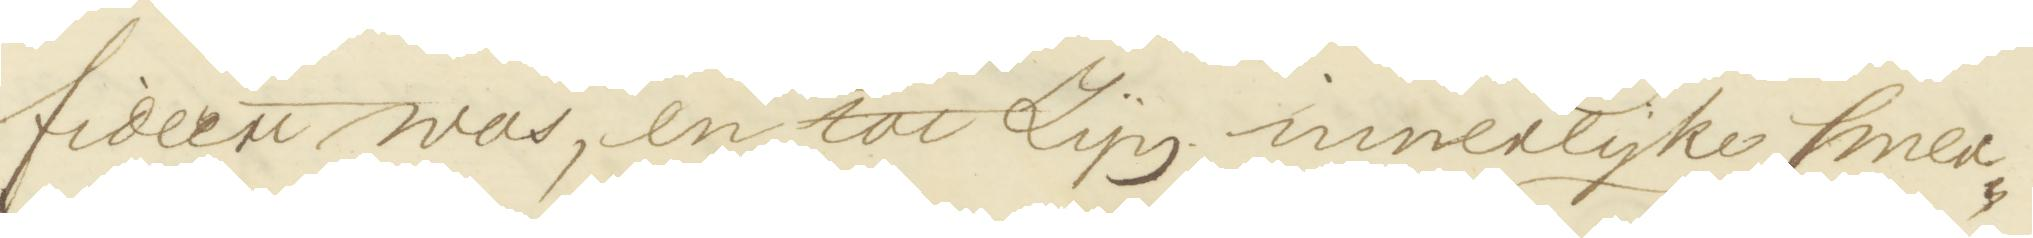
fideert was, en tot zijn innerlijke smer„
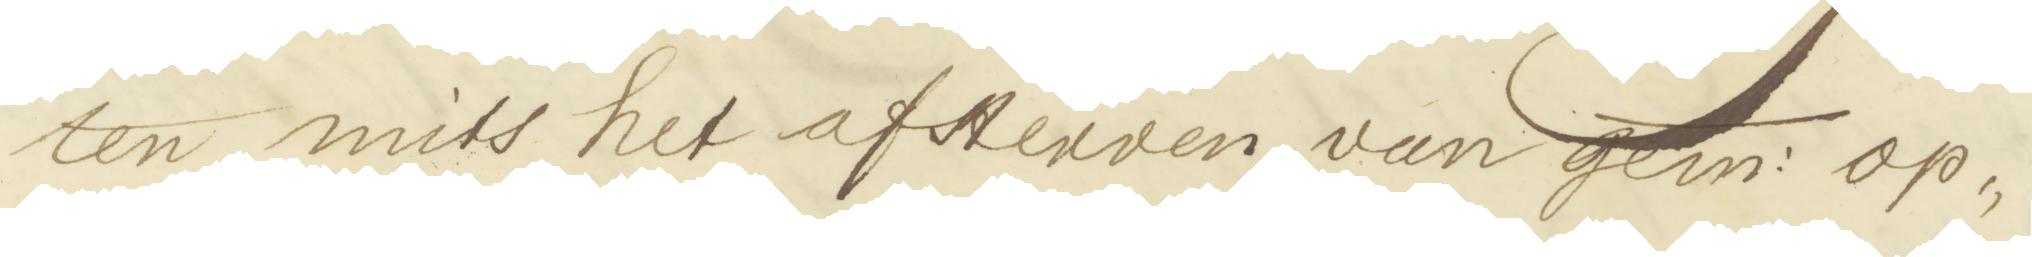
ten mits het afsterven van gem: op„
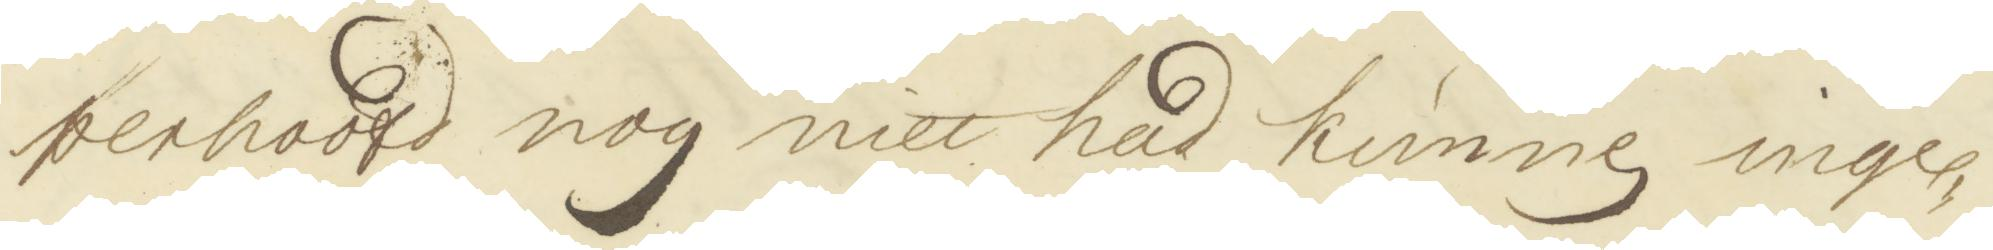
perhoofd nog niet had kunnen inge„
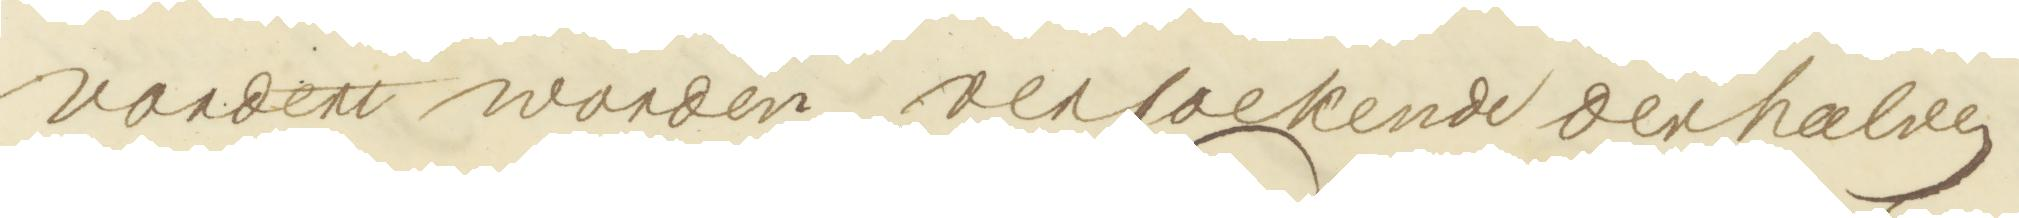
vordert worden, versoekende derhalven
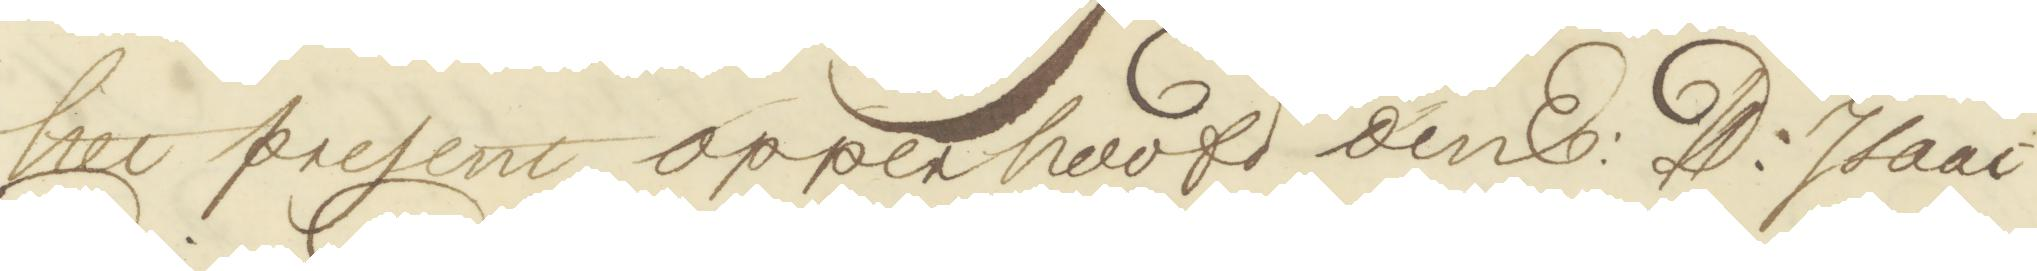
het present opperhoofd den E: D: Isaac
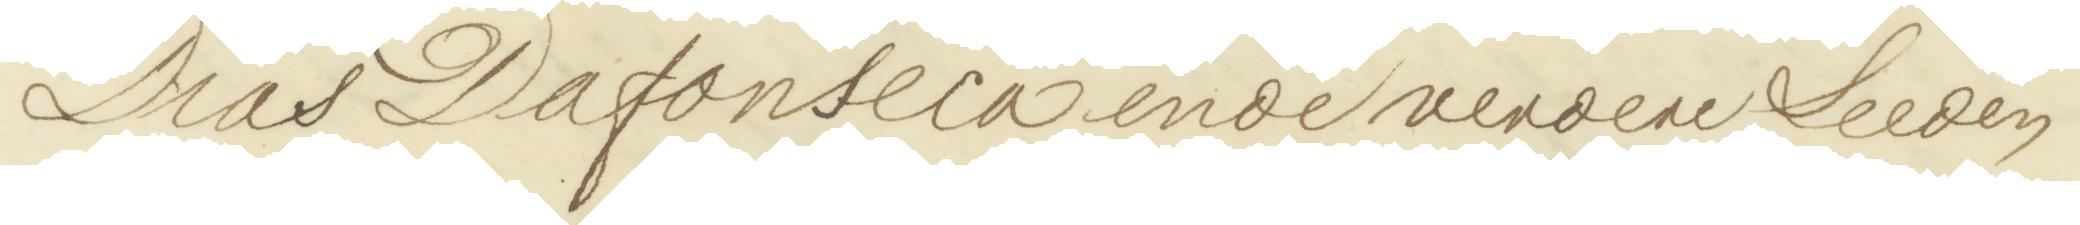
Dias Dafonseca ende verdere Leeden
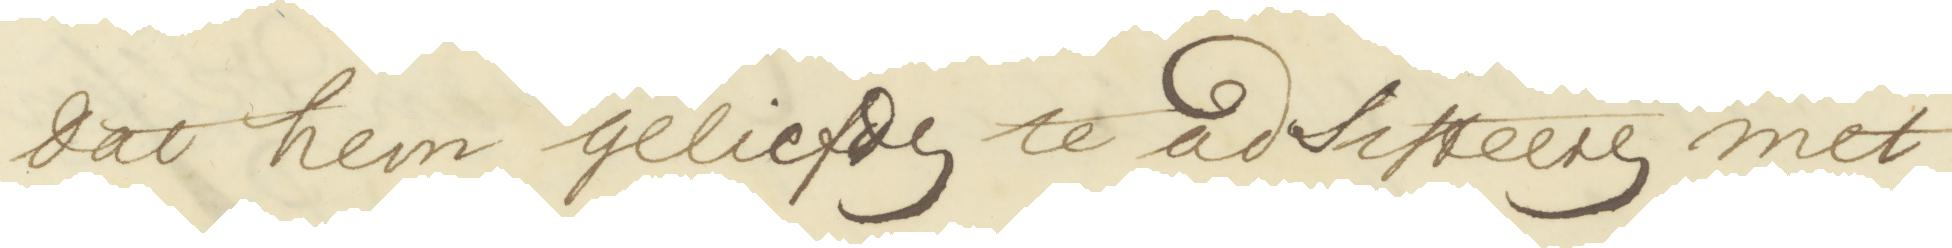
dat hem geliefden te adsisteeren met
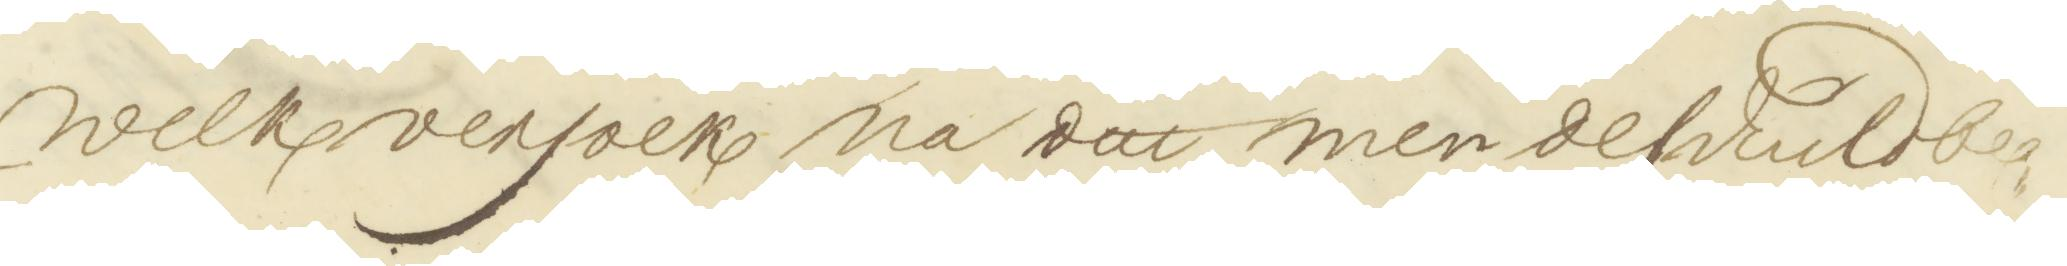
welk versoek na dat men de schuldbe„
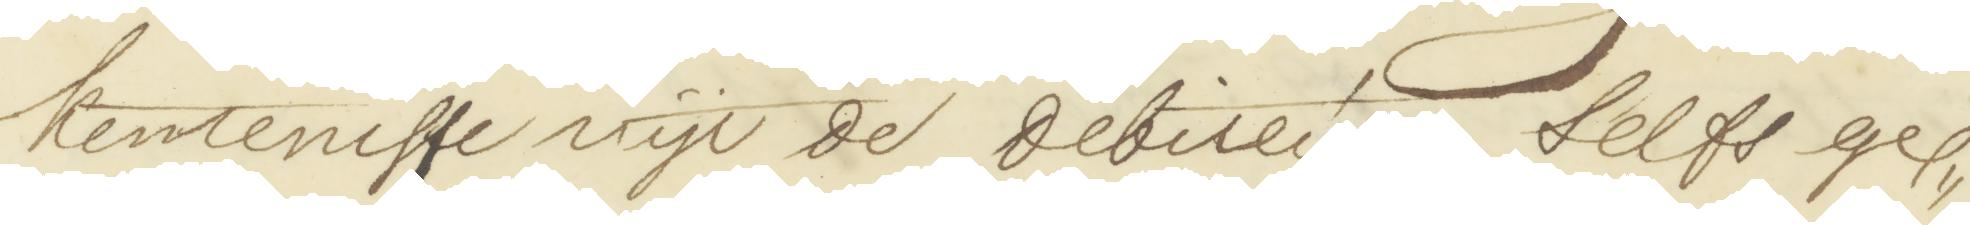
kentenisse uijt de debiteuren selfs ge„
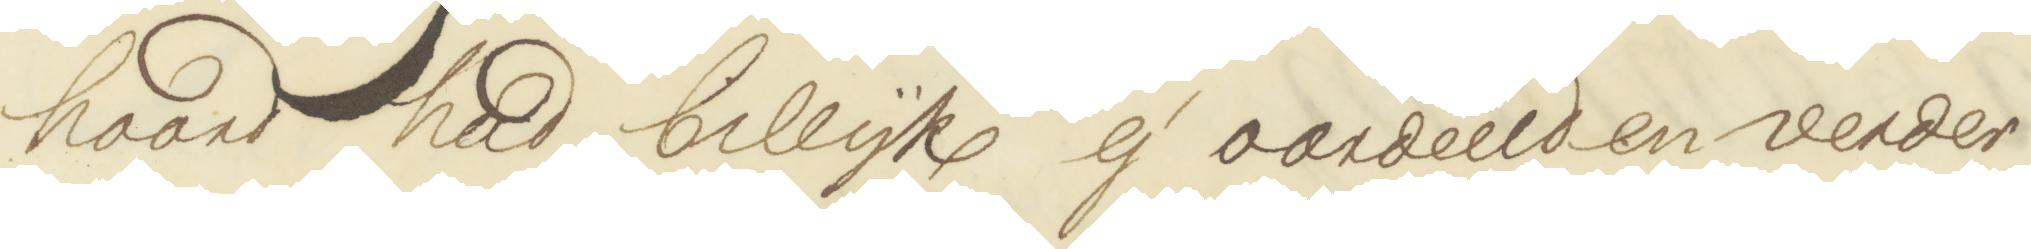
hoord had, billijk g’ oordeeld en verder
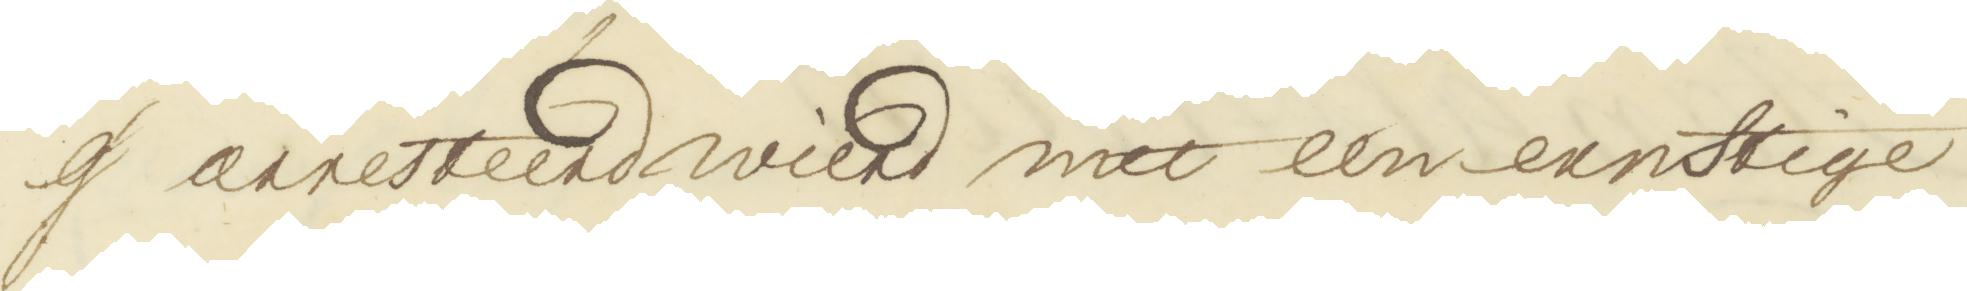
g’ arresteerd wierd met een ernstige
